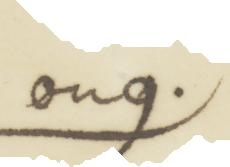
ong.
